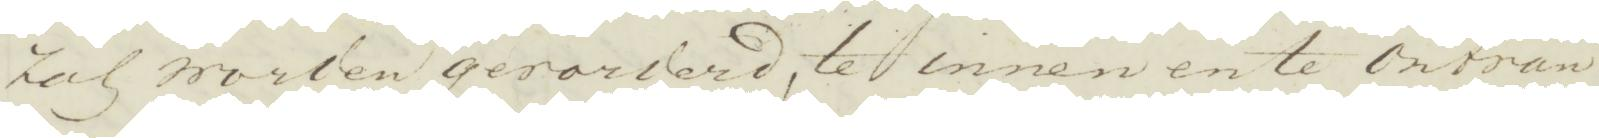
zal worden gevorderd, te innen en te ontvan
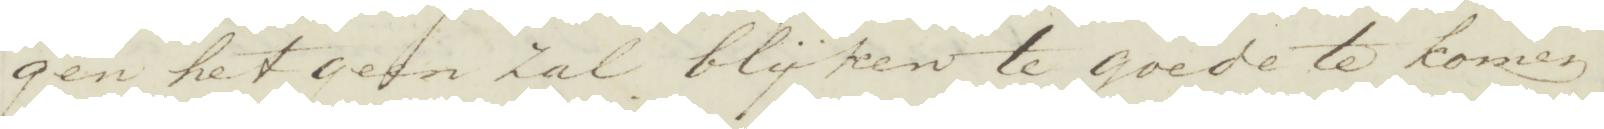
gen het geen zal blijken te goede te komen
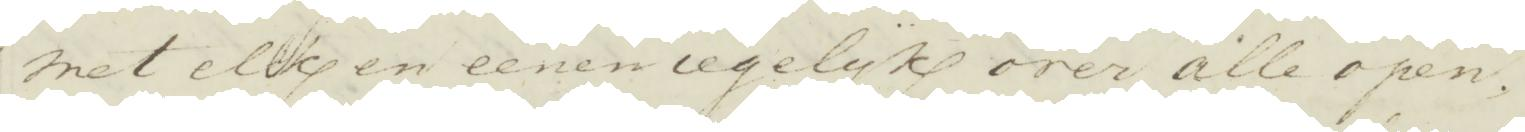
met elk en eenen iegelijk over alle open.
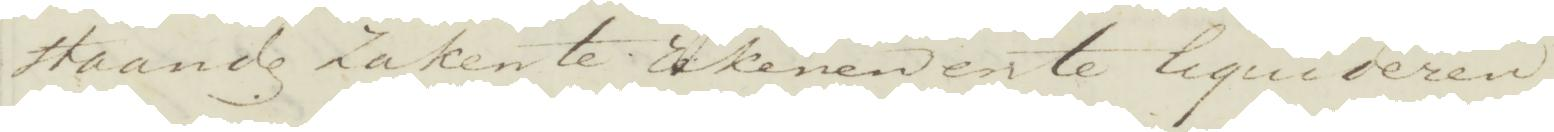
staande zaken te rekenen en te liquideren
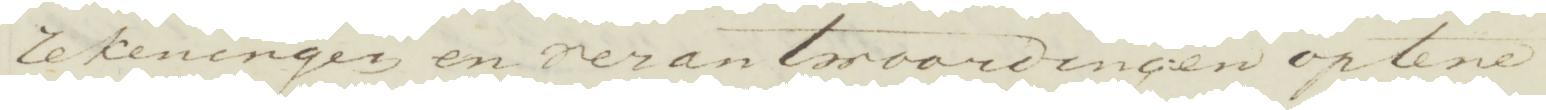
rekeningen en verantwoordingen optene
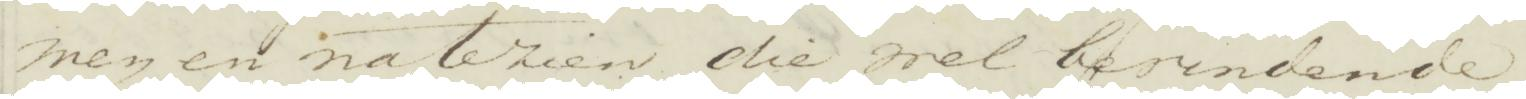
men en natezien die wel bevindende
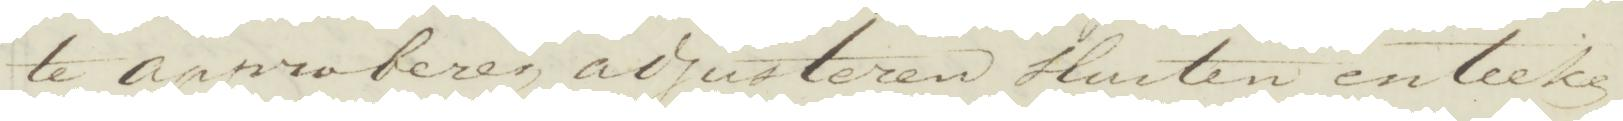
te approberen adjusteren sluiten en teeke
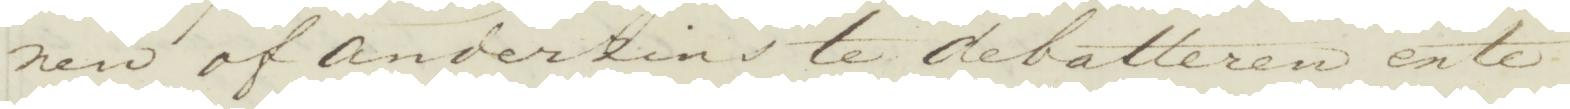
nen of anderzins te debatteren en te
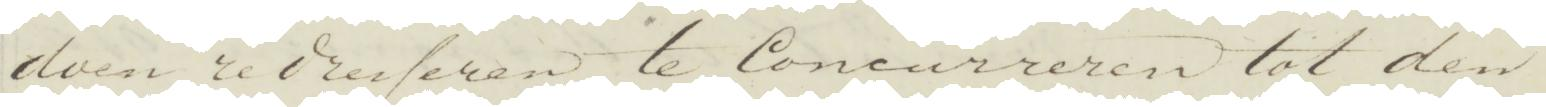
doen redresseren te Concurreren tot den
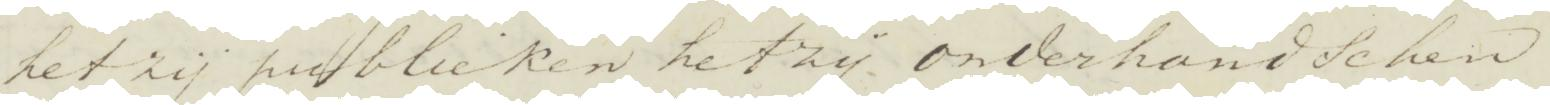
het zij publieken het zij onderhandschen
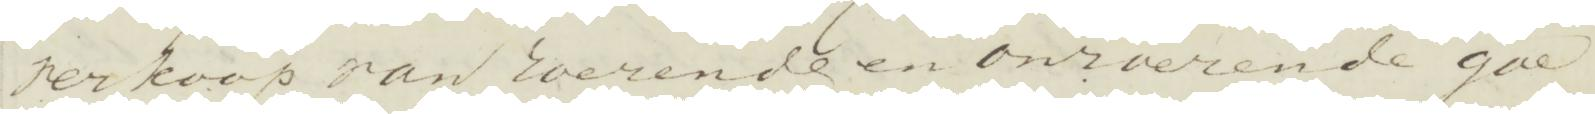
verkoop van roerende en onroerende goe
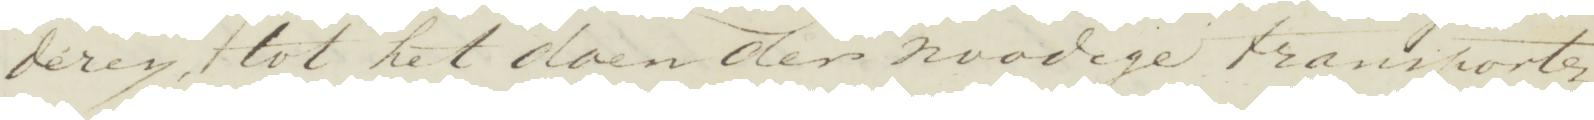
deren, tot het doen der noodige transporten
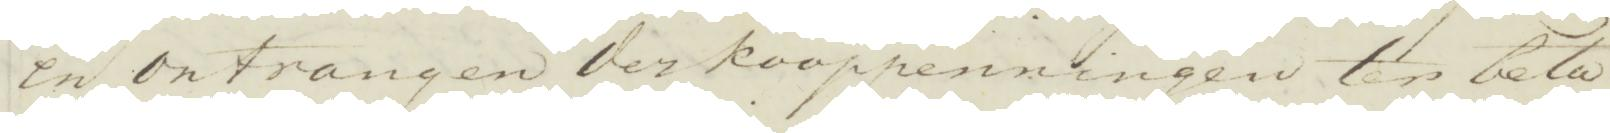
en ontvangen der kooppenningen ter beta
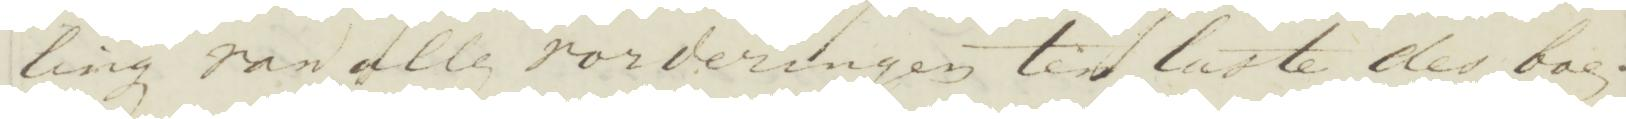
ling van alle vorderingen ten laste des boe
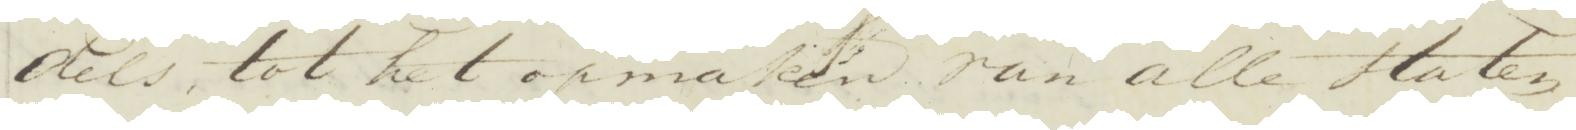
dels, tot het opmaken van alle staten
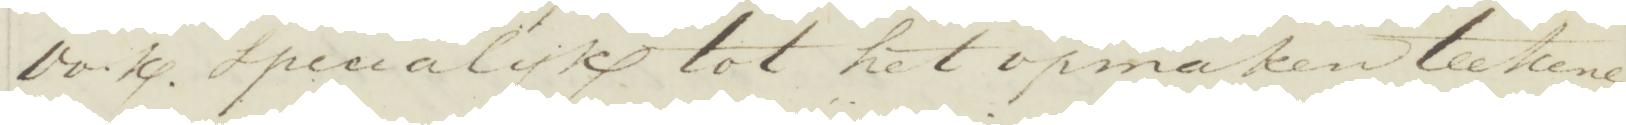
ook specialijk tot het opmaken teekenen
